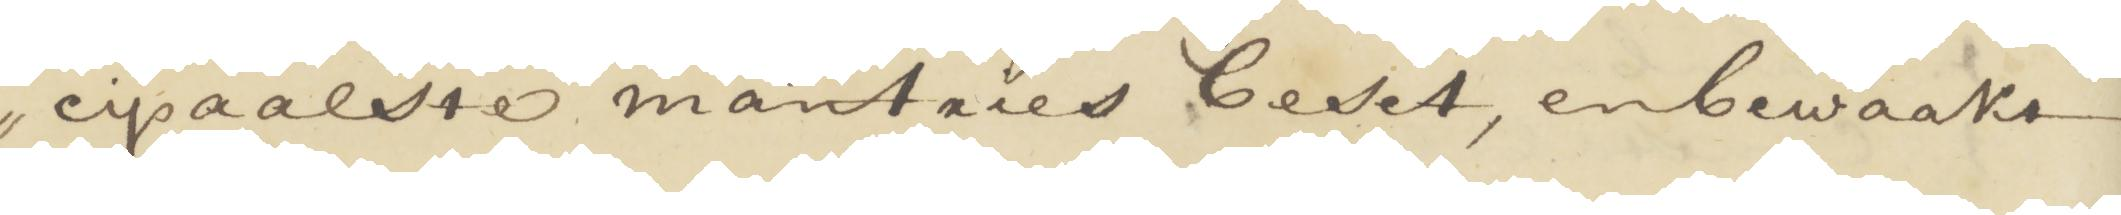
,cipaalste mantries beset, en bewaakt
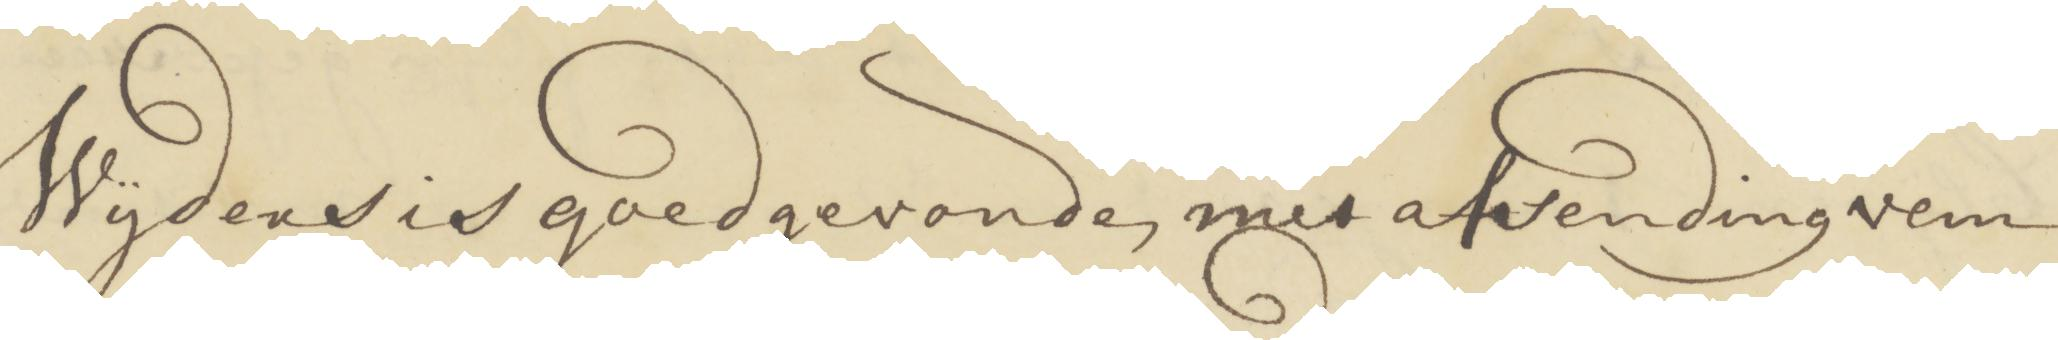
Wijders is goed gevonden met afsending van
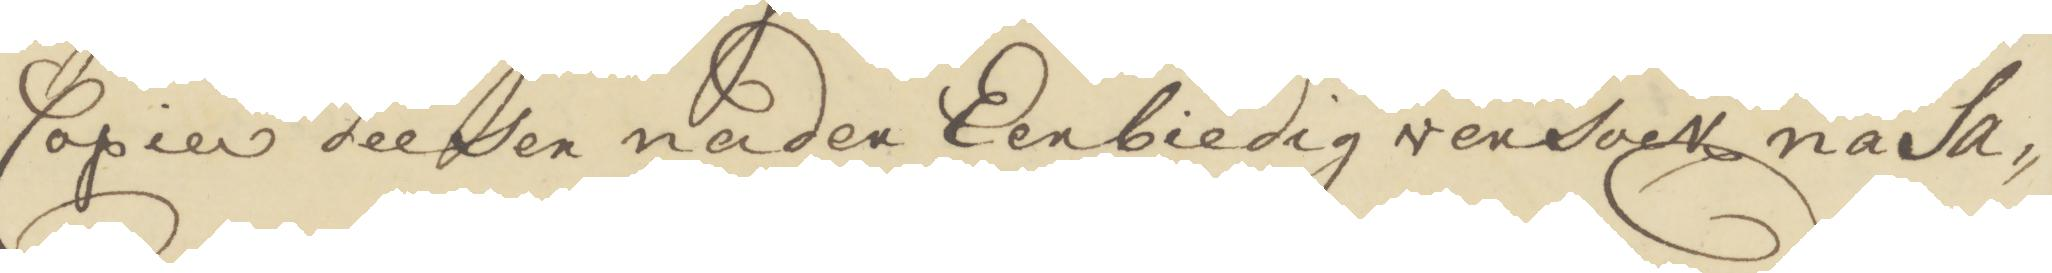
Copia deeser nader Eerbiedig versoek na sa„
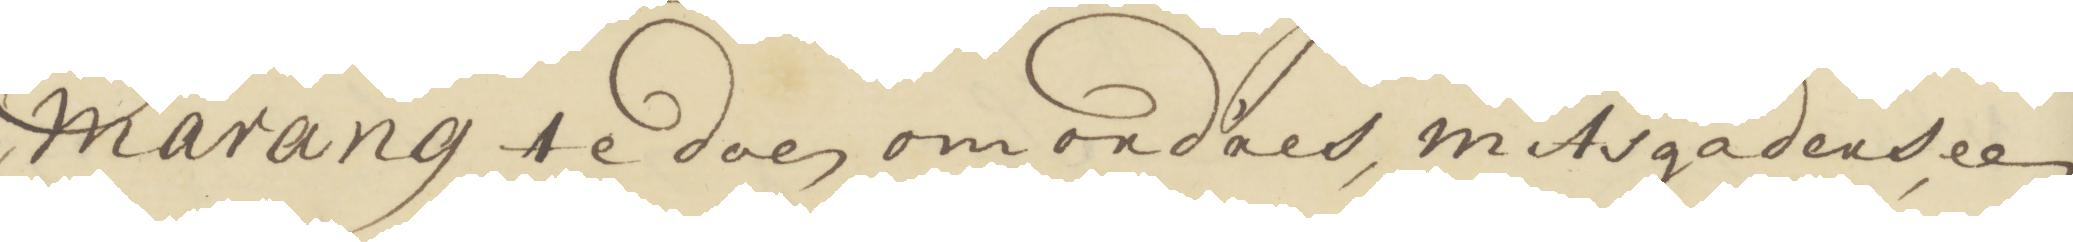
marang te doen om ord'res, mitsgaders, een
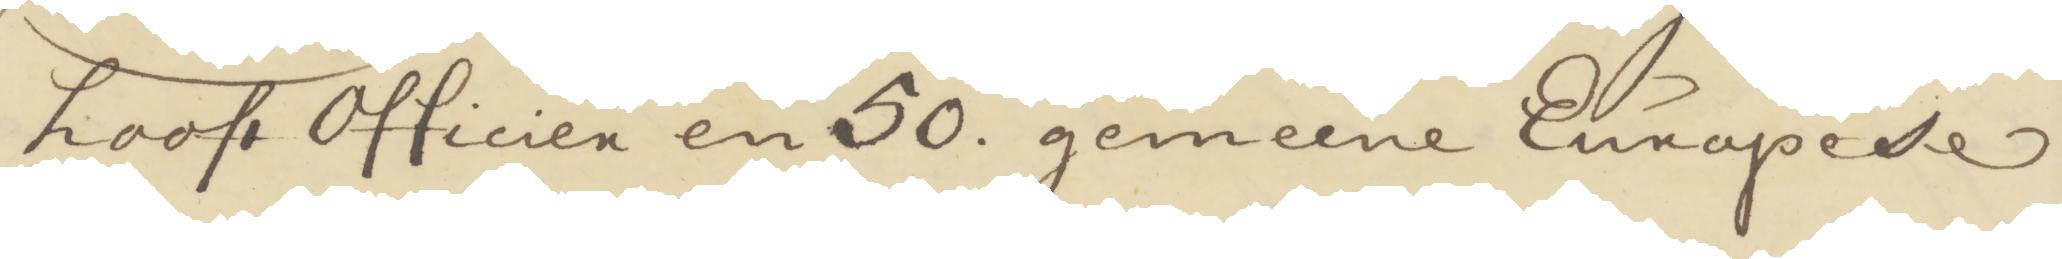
hooft Officier en 50. gemeene Europese
